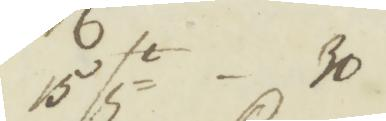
15 pr=t - 30
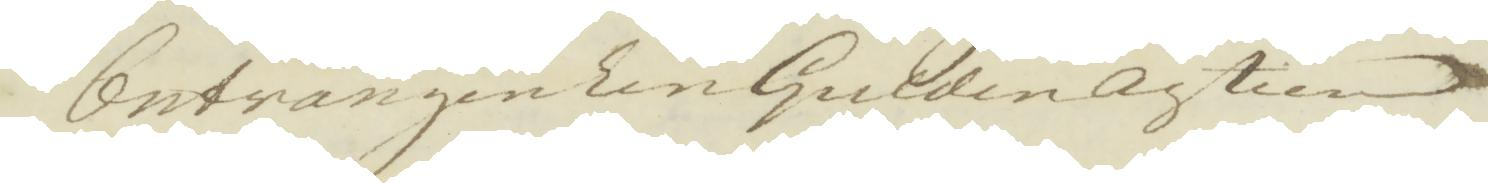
Ontvangen Een Gulden agtien
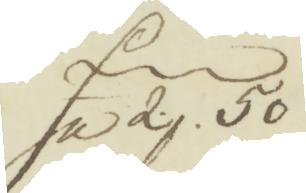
Fr 2.50
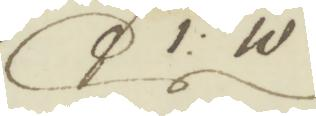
ƒ 1:18
